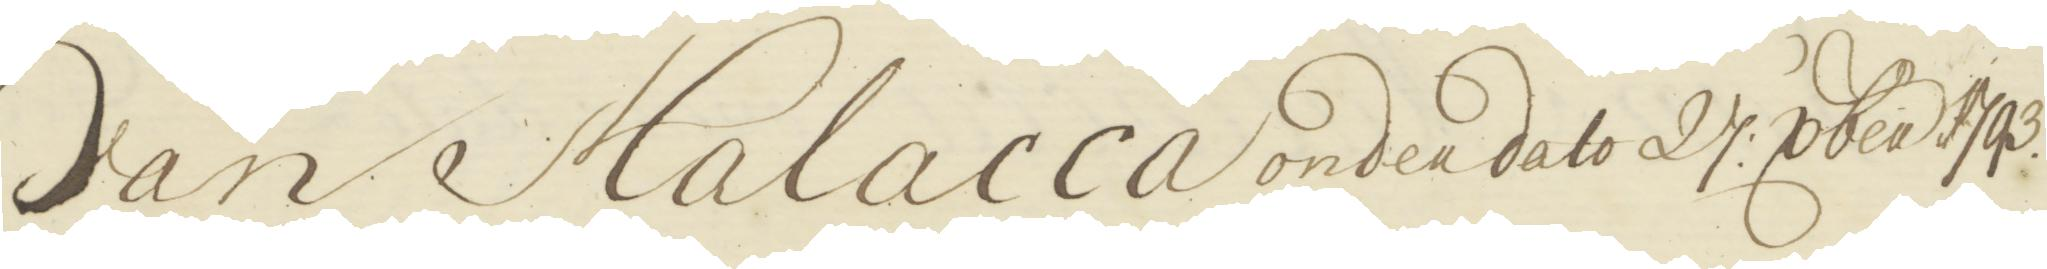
Van Malacca onder dato 27: xber 1743:
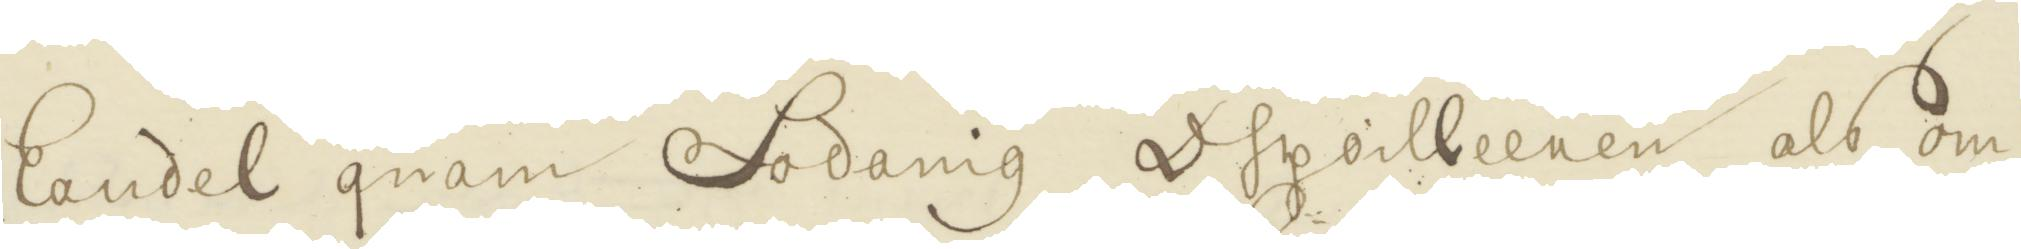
handel quam Sodanig te spoilleeren als om
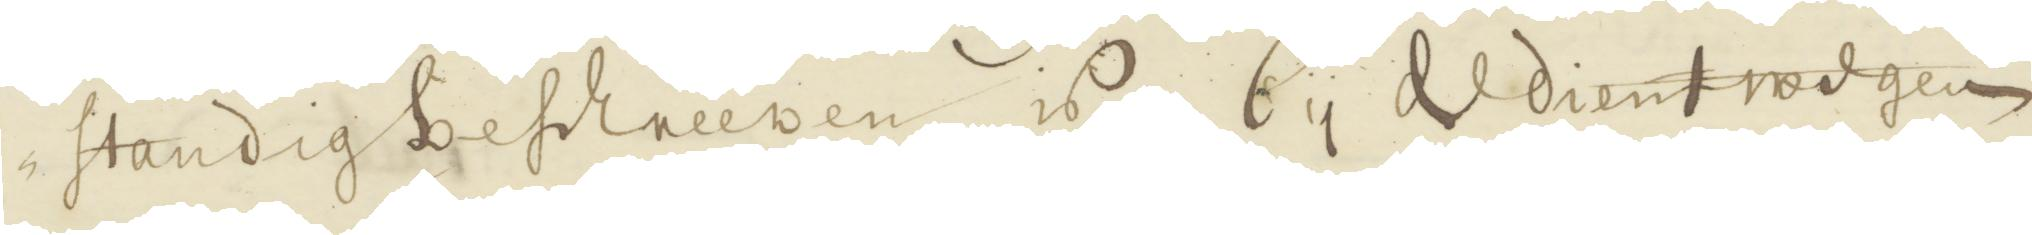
„standig beschreeven is bij de dientwegen
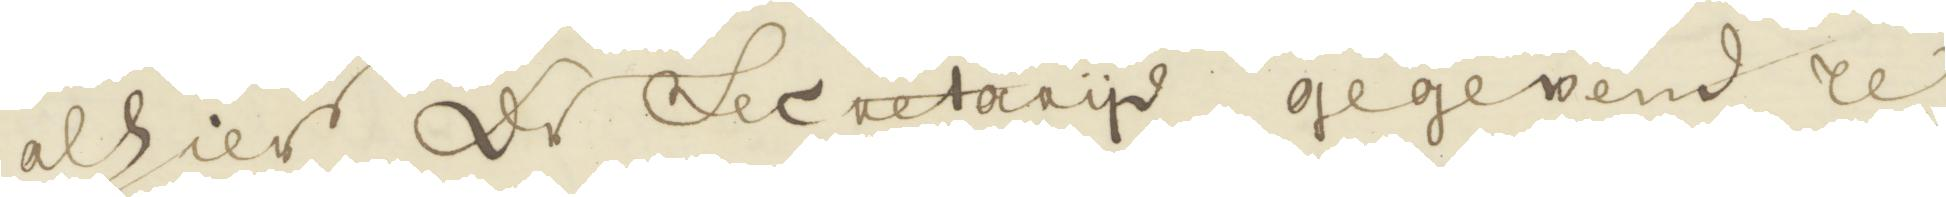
alhier ter Secretarije gegevene re
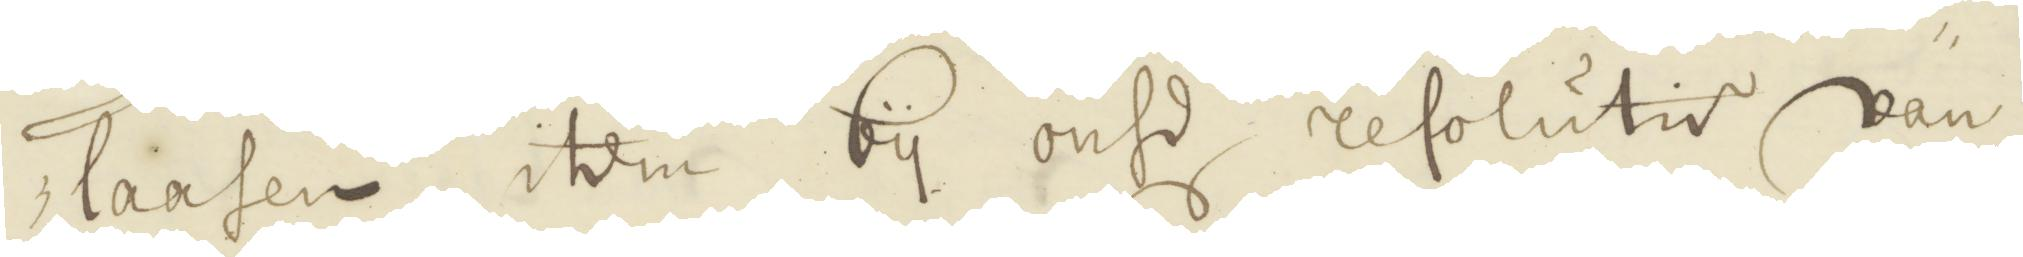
„laasen item bij onse resolutie van
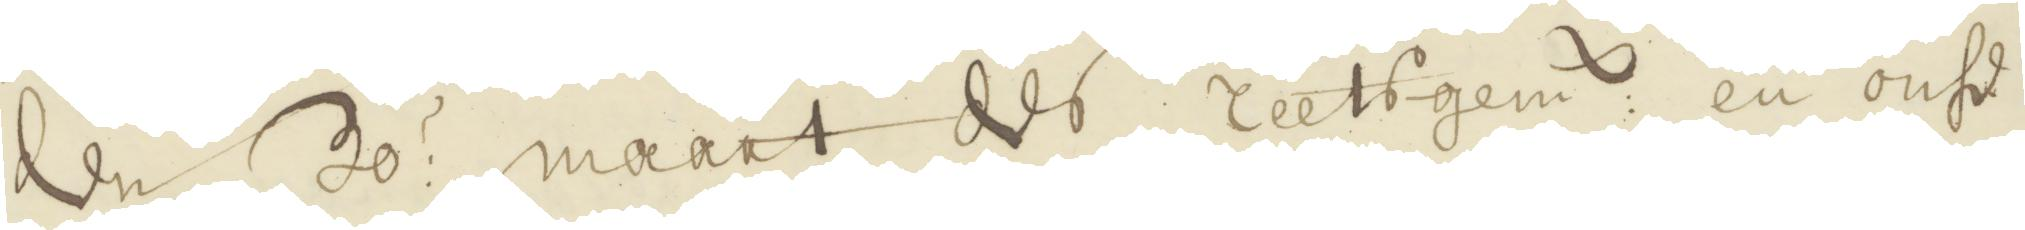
den 30:' maart des reets gem:' en onse
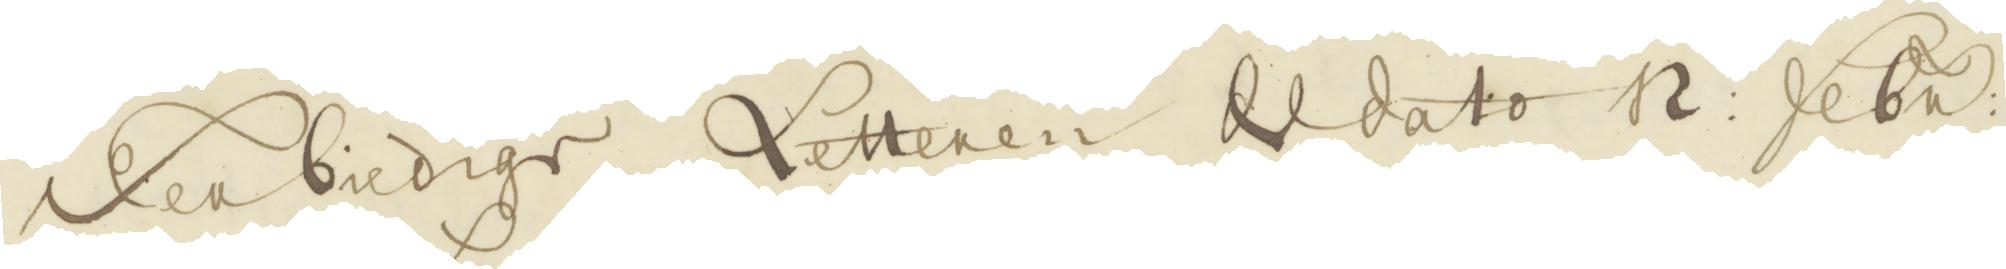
Eerbiedige Letteren de dato 12:' febr:
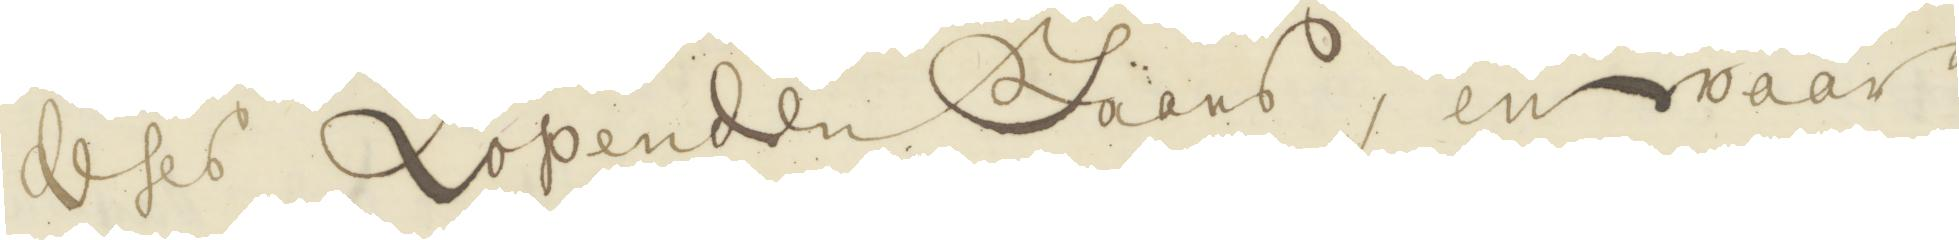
deses Lopenden Iaars, en waar
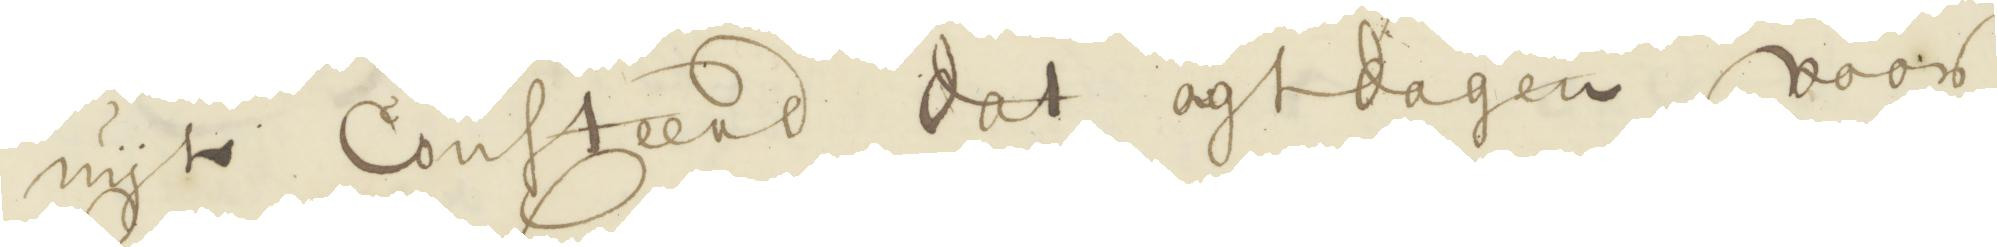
uijt Consteerd dat agt dagen voor
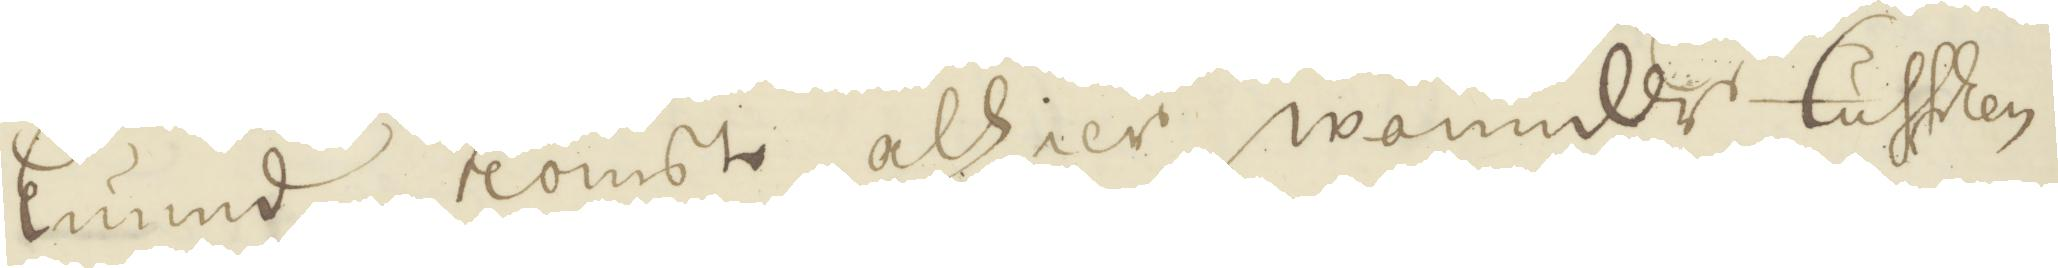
hunne komst alhier wanneer tusschen
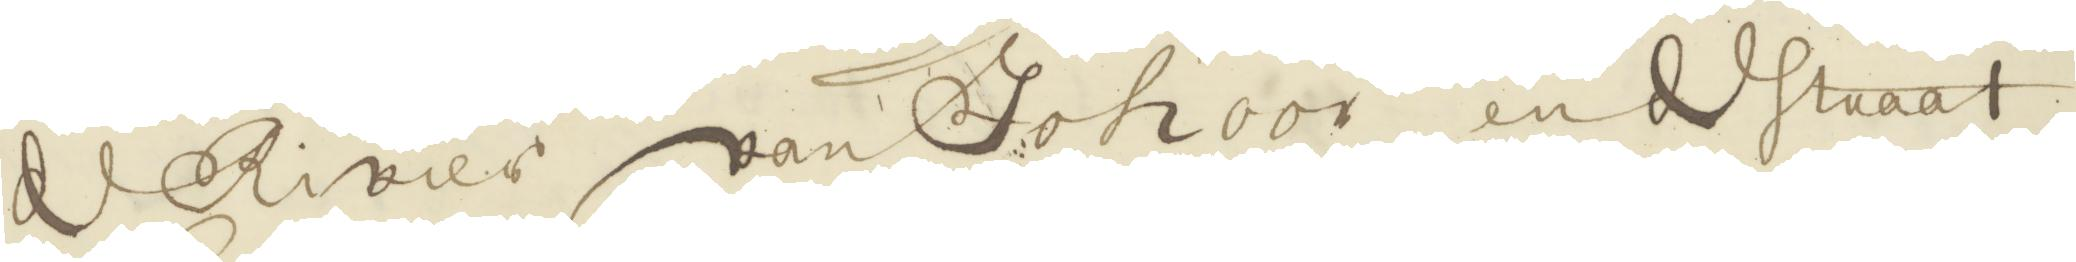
de Rivier van Johoor en de straat
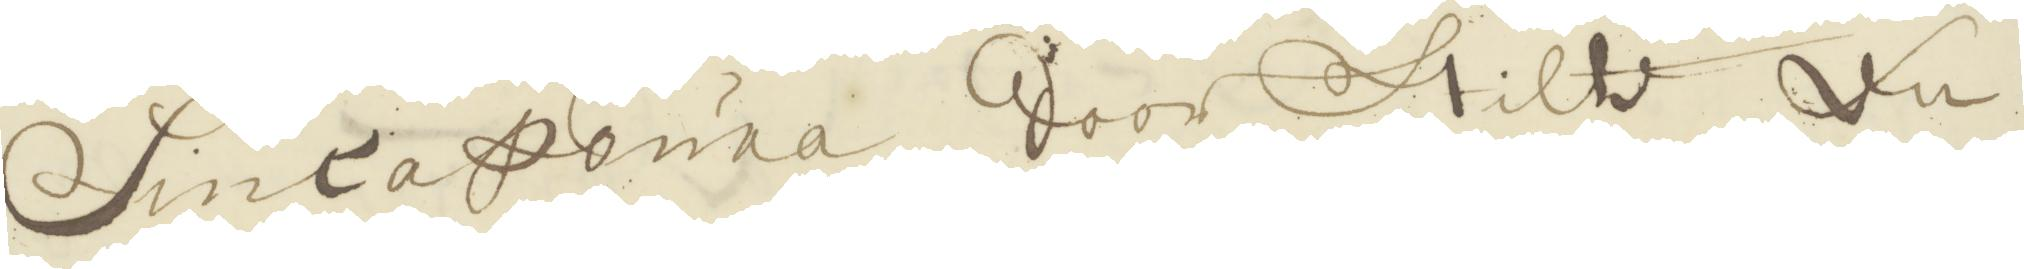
Sincapoura door Stilte ten
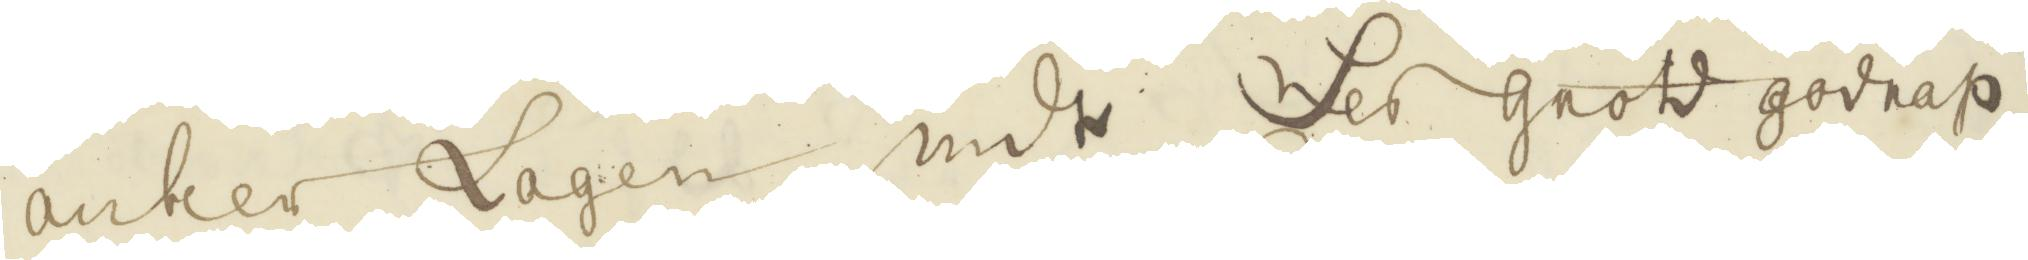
anker Lagen met Ses grote goerap
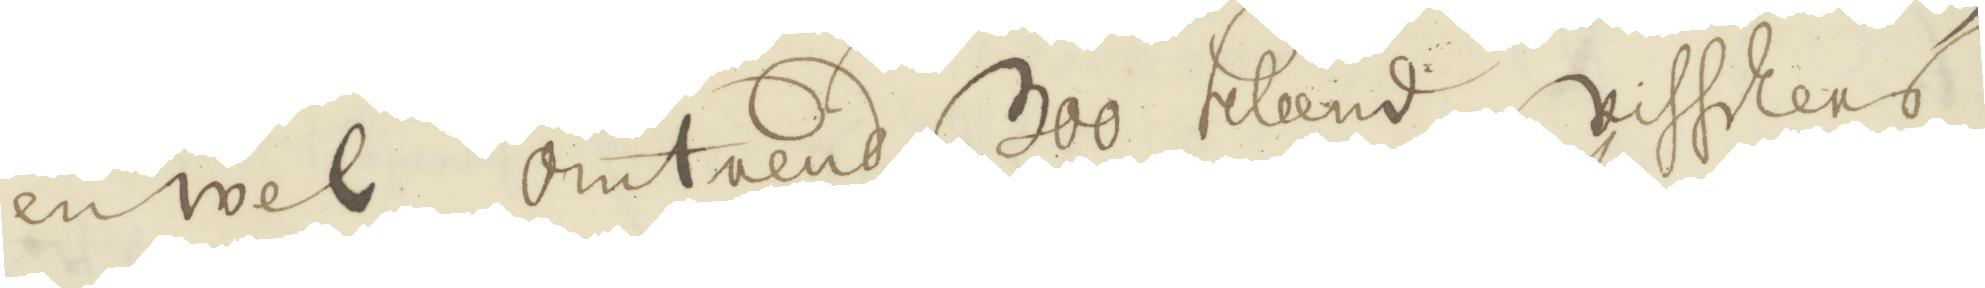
en wel omtrend 300 kleene visschers
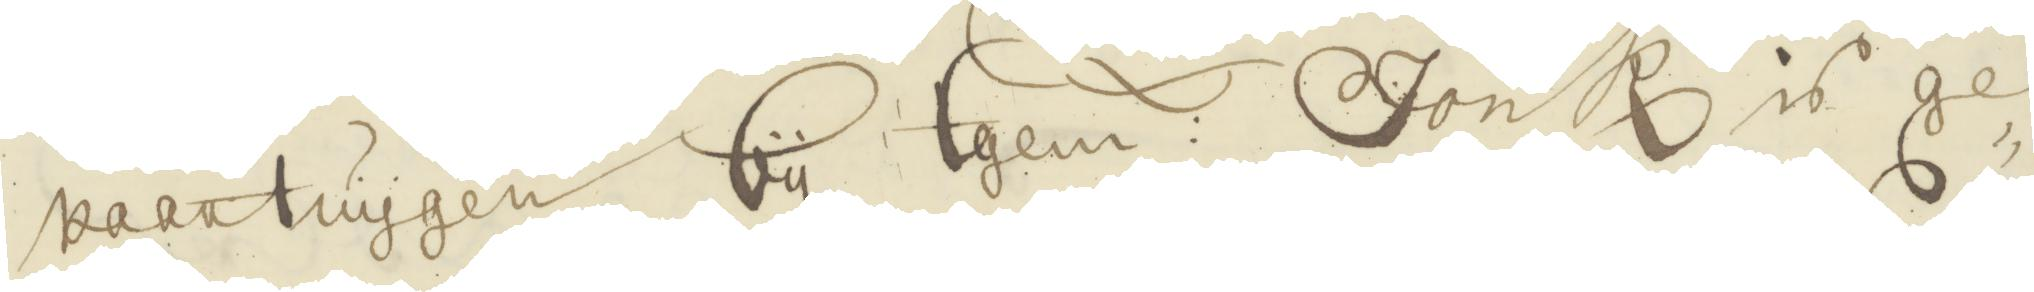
vaartuijgen bij 't gem: Ionk is ge„
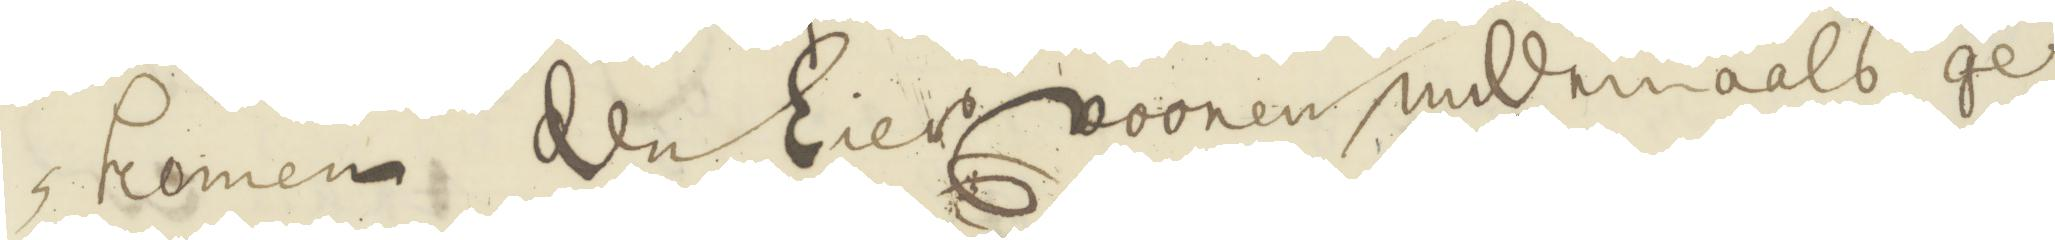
„komen, den hier vooren meermaals ge
